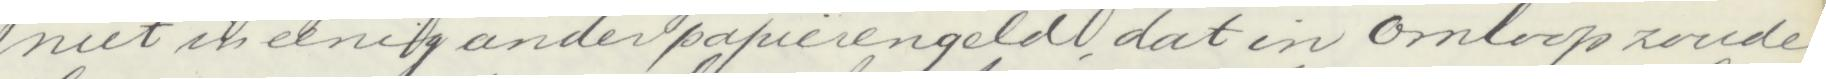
niet in eenig ander papieren geld, dat in omloop zoude
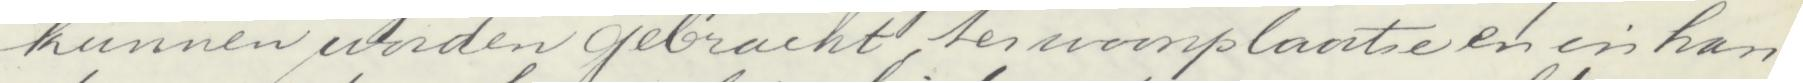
kunnen worden gebracht ter woonplaatse en in han
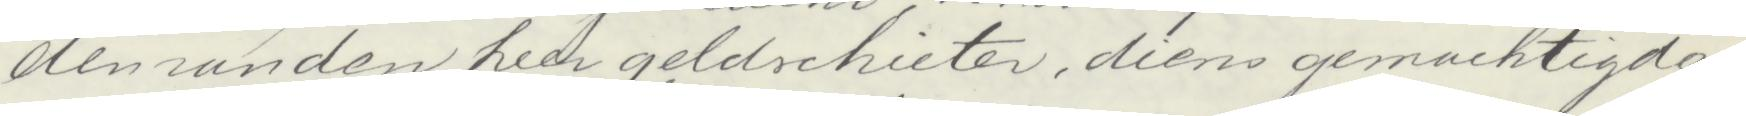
den van den heer geldschieter, diens gemachtigde,
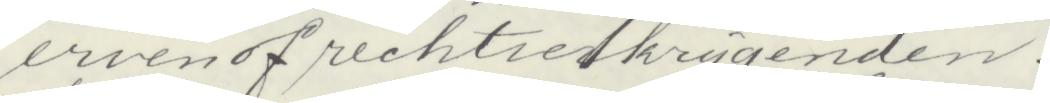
erven of rechtverkrijgenden.
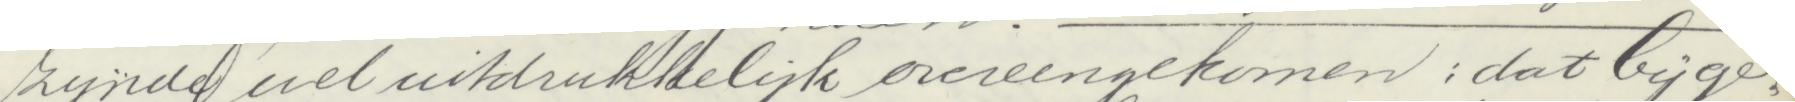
zijnde wel uitdrukkelijk overeengekomen; dat bij ge„
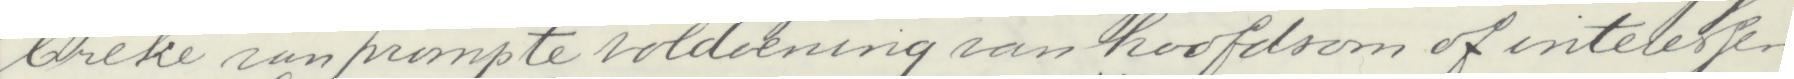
breke van prompte voldoening van hoofdsom of interessen
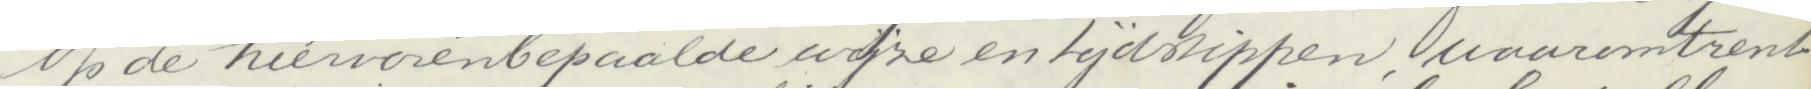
op de hiervorenbepaalde wijze en tijdstippen waaromtrent
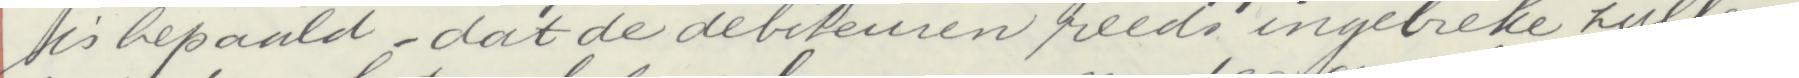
is bepaald - dat de debiteuren reeds ingebreke zullen
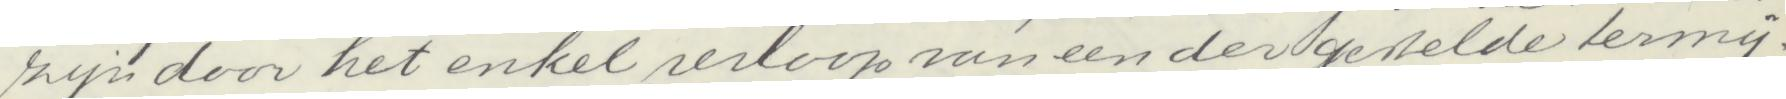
zijn door het enkel verloop van een der gestelde termij„
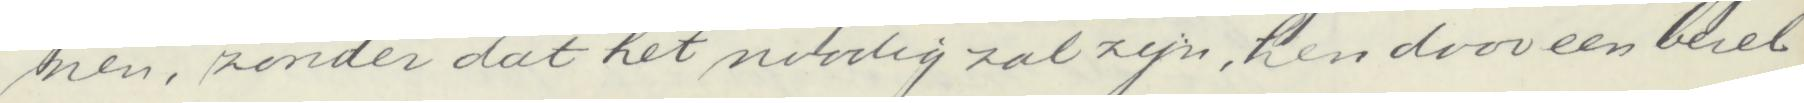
nen, zonder dat het noodig zal zijn, hen door een bevel
